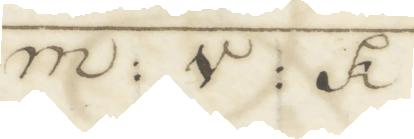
m : v : k
